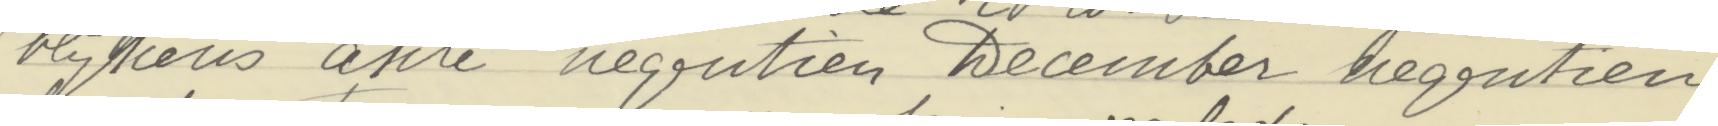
blijkens akte negentien December negentien
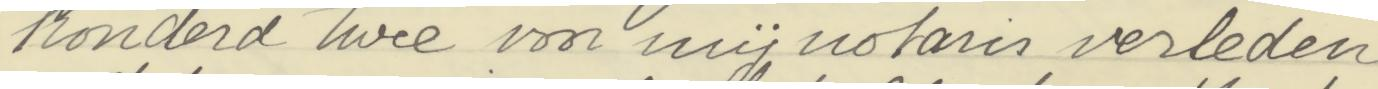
honderd twee voor mij notaris verleden
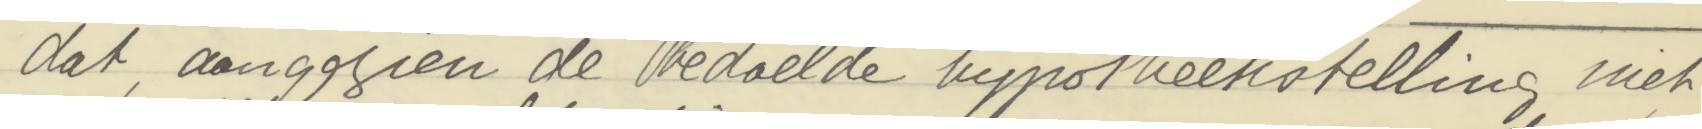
dat, aangezien de bedoelde hypotheekstelling niet
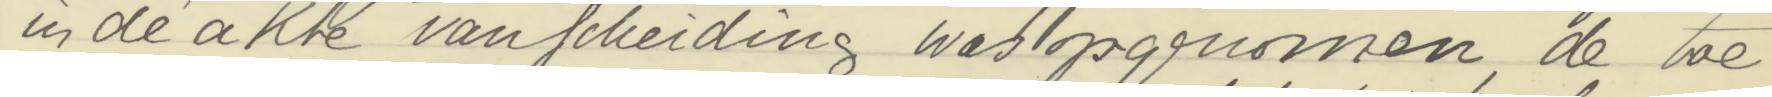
in de akte van scheiding was opgenomen, de toe
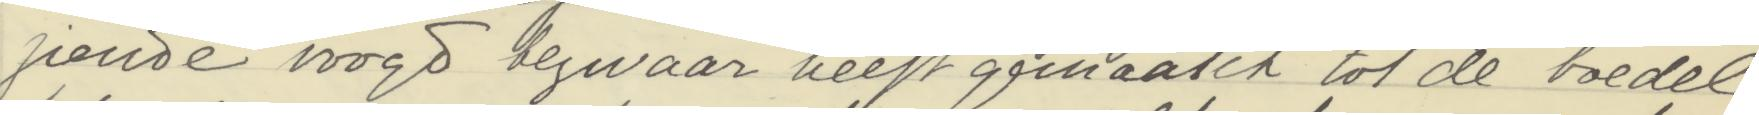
ziende voogd bezwaar heest gemaakt tot de boedel
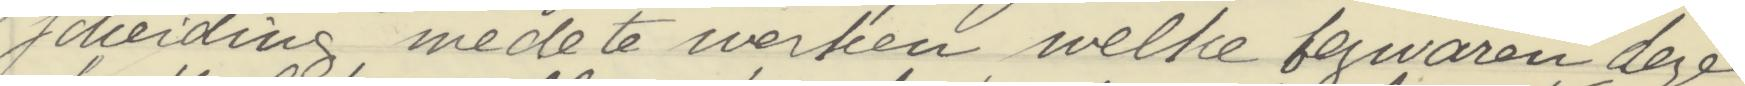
scheiding mede te werken, welke bezwaren deze
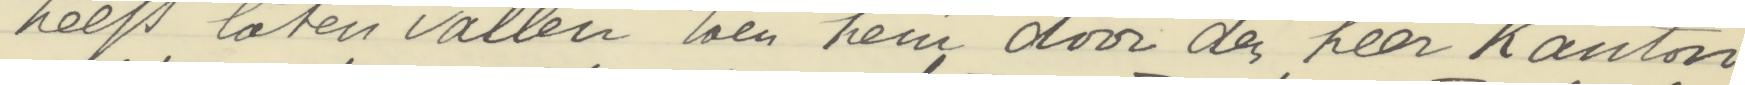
heeft laten vallen toen hem door den heer Kanton
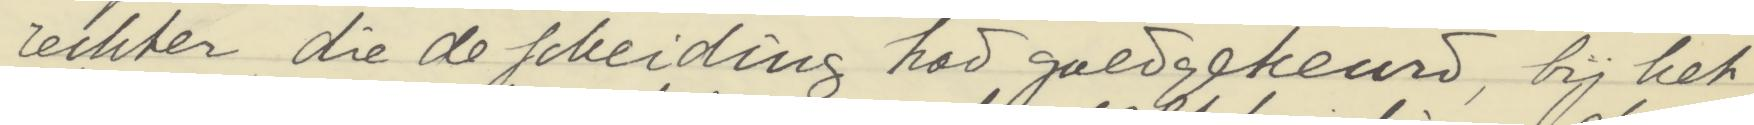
rechter, die de scheiding had goedgekeurd, bij het
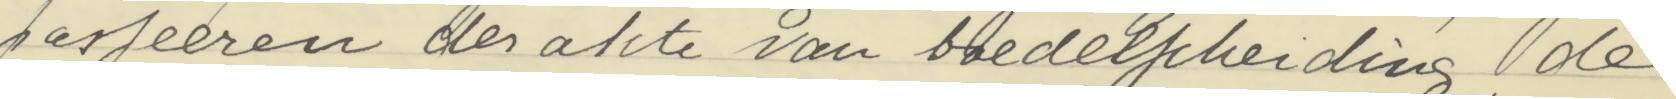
passeeren der akte van boedelscheiding, de
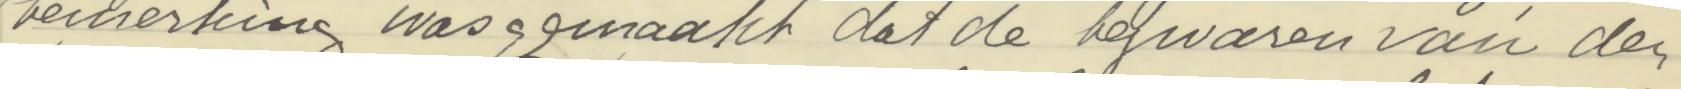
bemerking was gemaakt dat de bezwaren van den
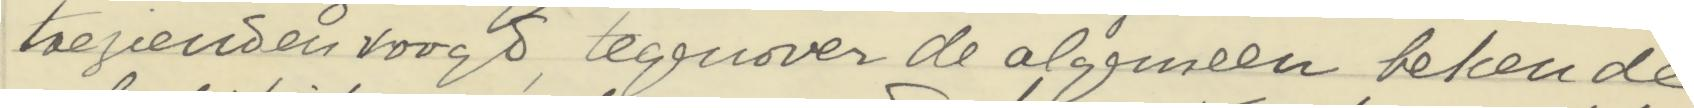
toezienden voogd tegenover de algemeen bekende
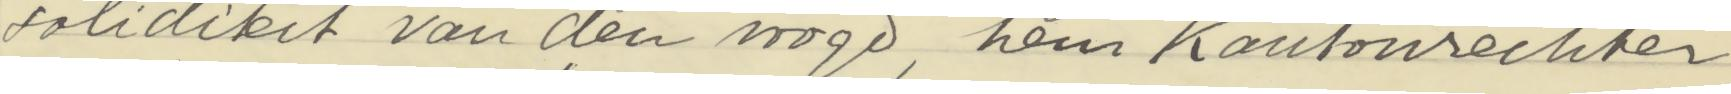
soliditeit van den voogd, hem Kantonrechter
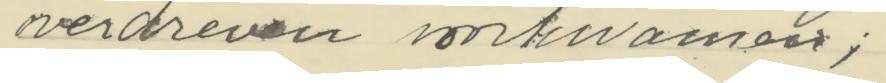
overdreven voorkwamen;
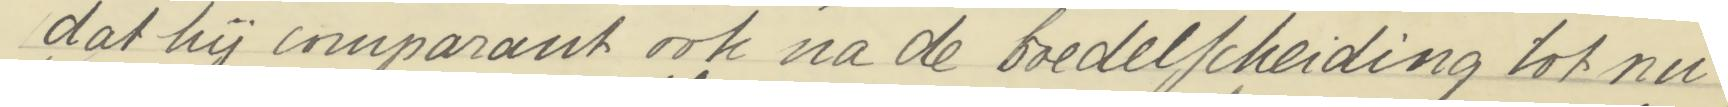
dat hij comparant ook na de boedelscheiding tot nu
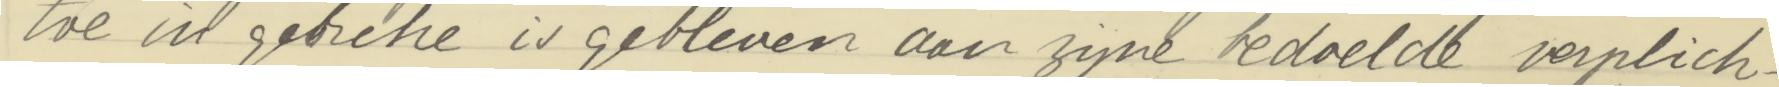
toe in gebreke is gebleven aan zijne bedoelde verplich
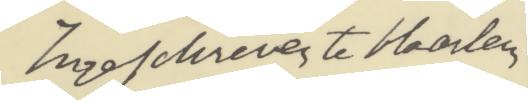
Ingeschreven te Haarlem
